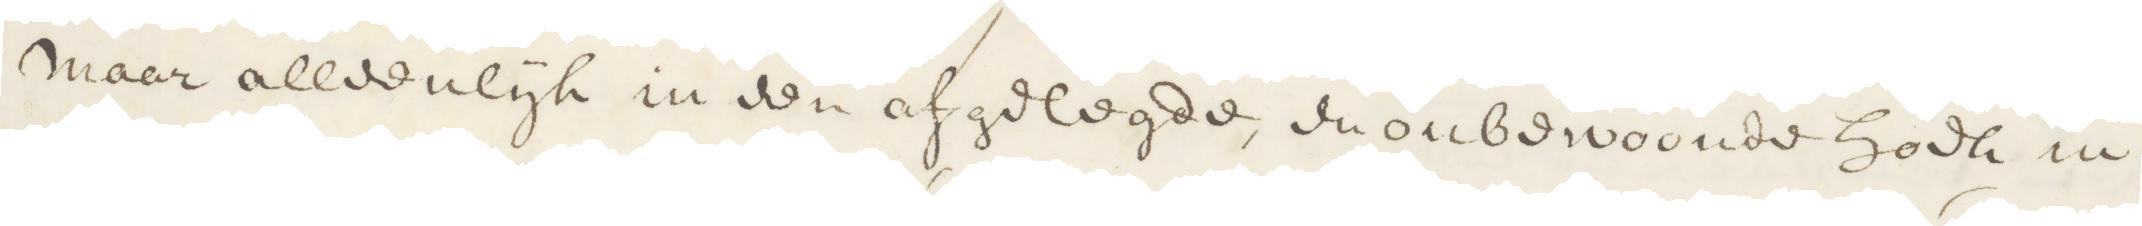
maar alleenlijk in een afgelegde, en onbewoonde hoek in
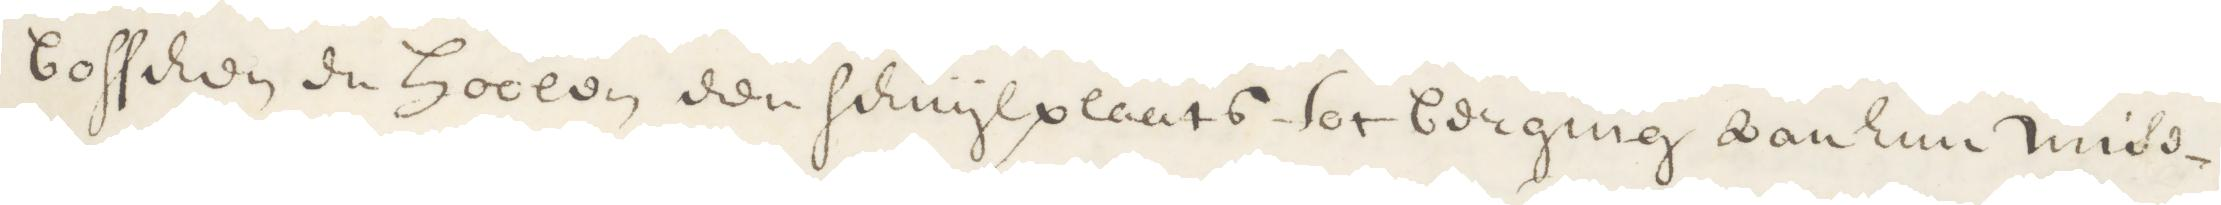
bosschen en hoolen een schuijlplaats tot berging van hun mise_
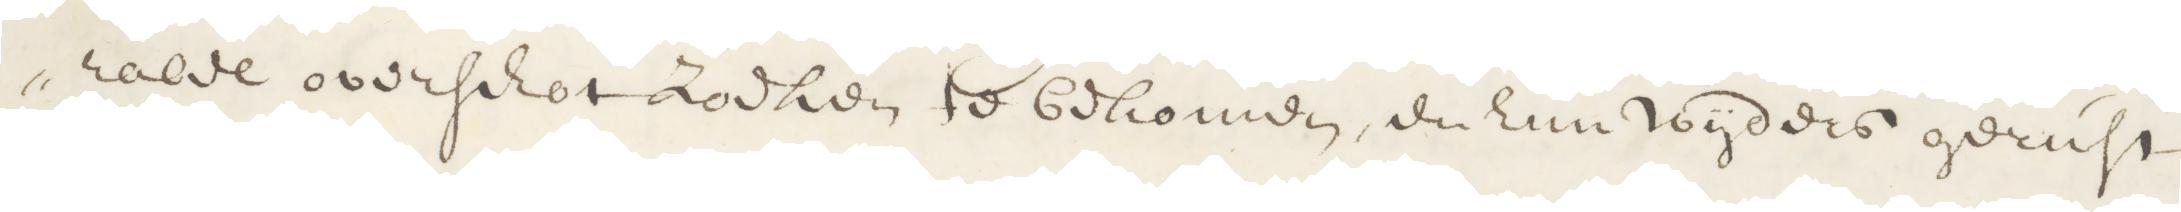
„ rabel overschot zoeken te bekomen, en hun wijders gerust
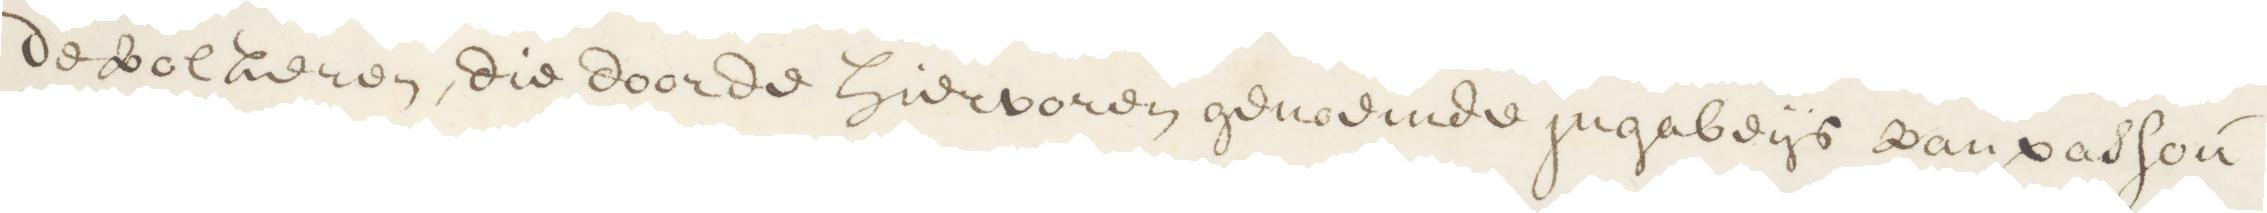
de volkeren, die door de hiervoren genoemde jngabeijs van passou
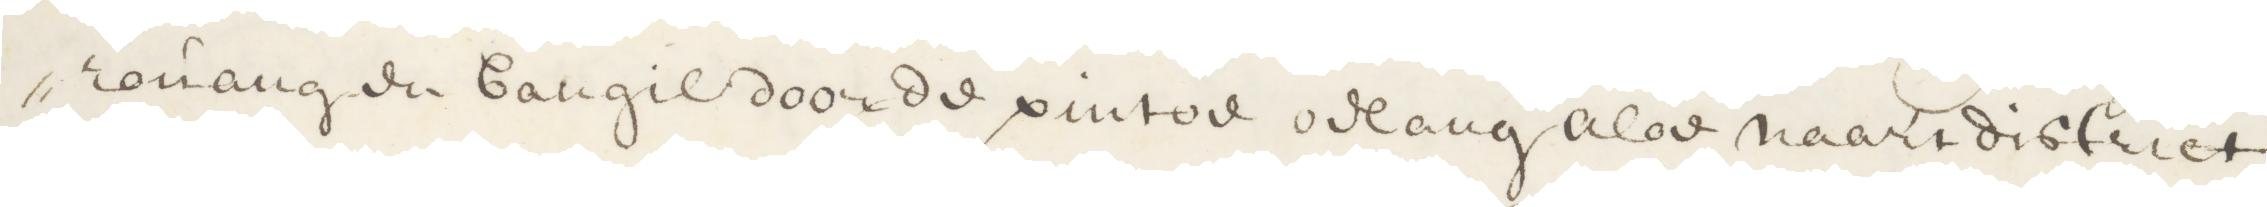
„rouang en bangil door de pintoe oelang aloe naar't district
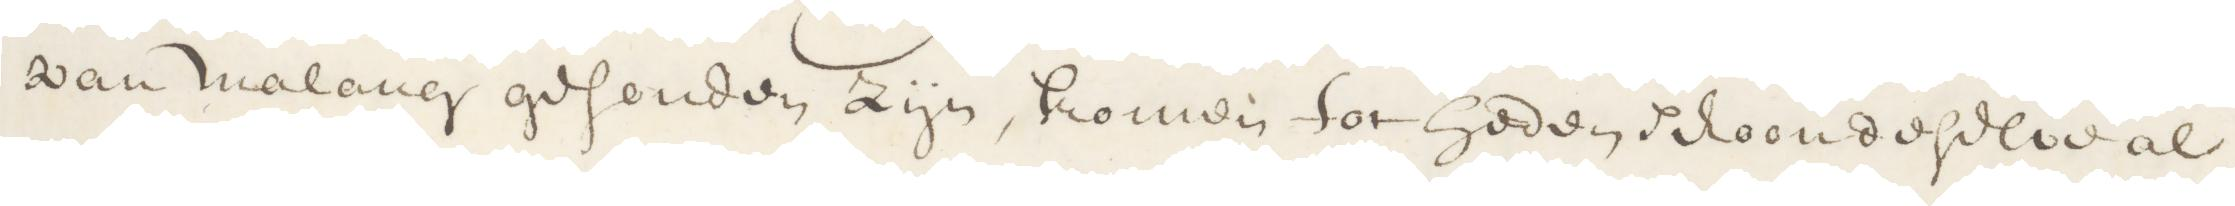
van malang gesonden zijn, komen tot heden schoon deselve al
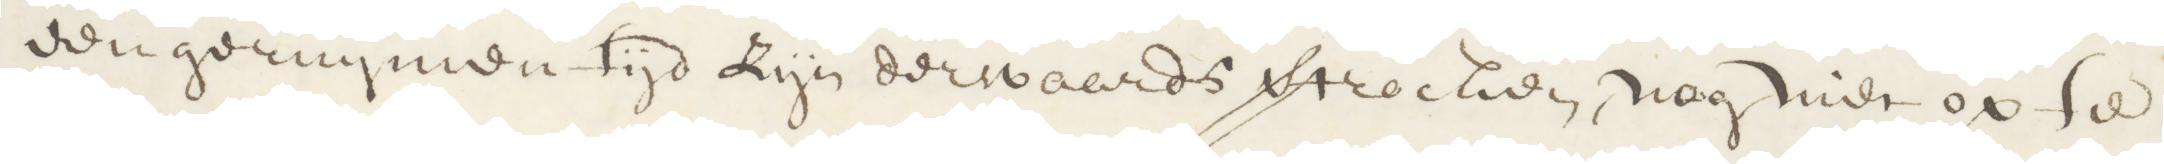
een geruijmen tijd zijn derwaards vertrocken, nog niet op te
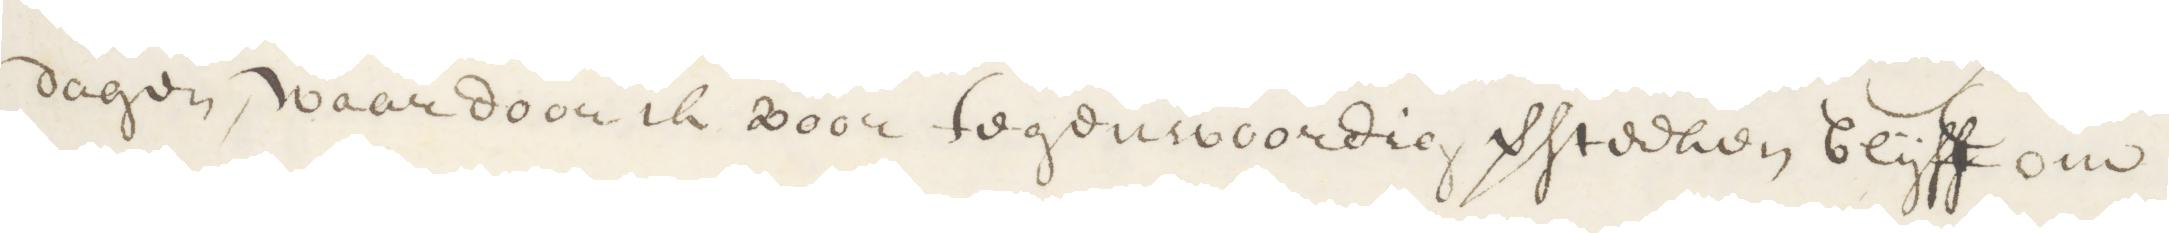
dagen, waardoor ik voor tegenwoordig versteeken blijff om
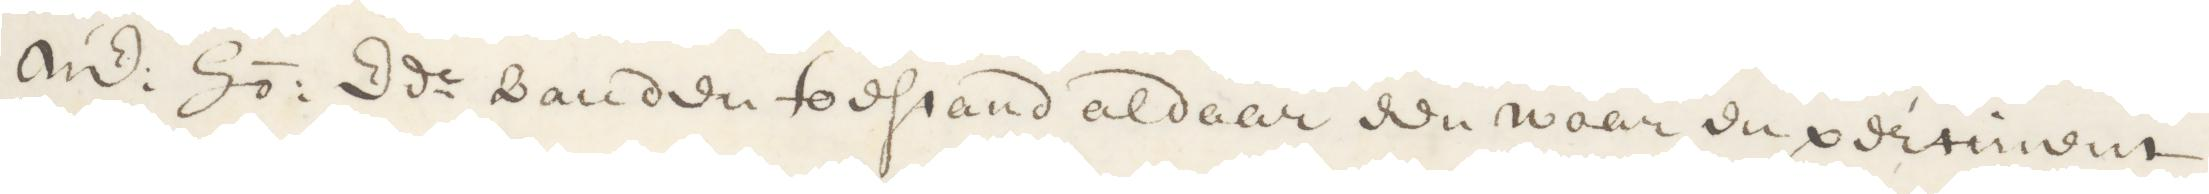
uE: Ho: Ed_e van den toestand aldaar een waar en pertinent
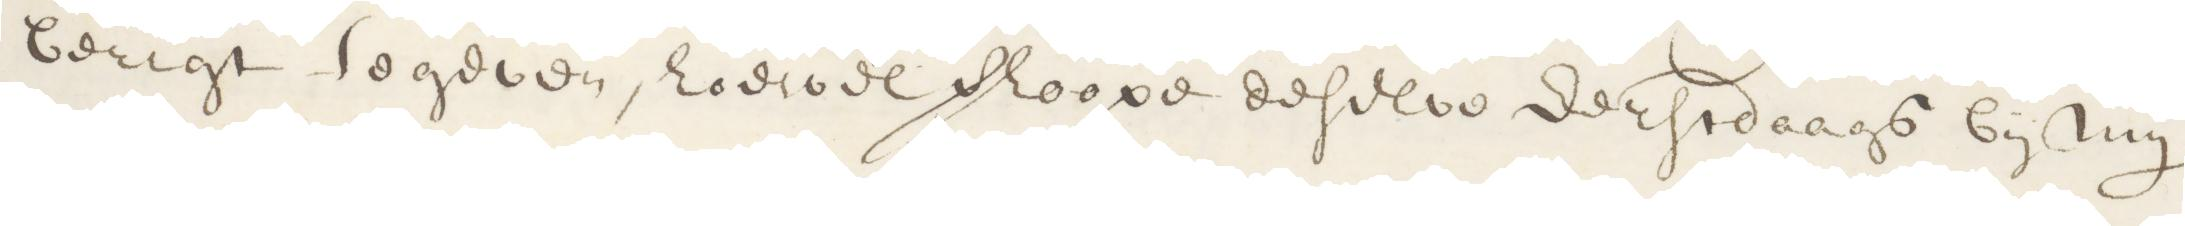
berigt tegeven, hoewel verhoope deselve Eerstdaags bij mij
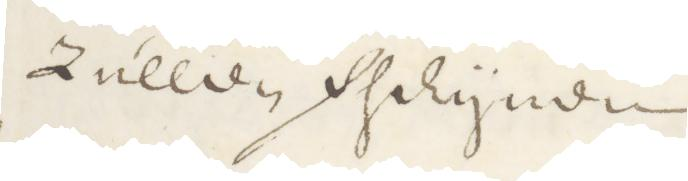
zullen verschijnen
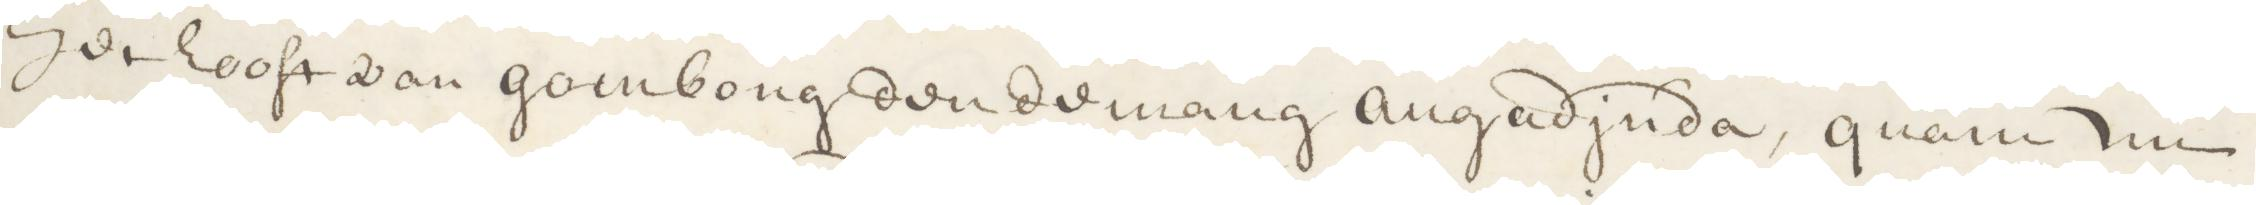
Het hooft van gombong den demang angadjuda, quam nu
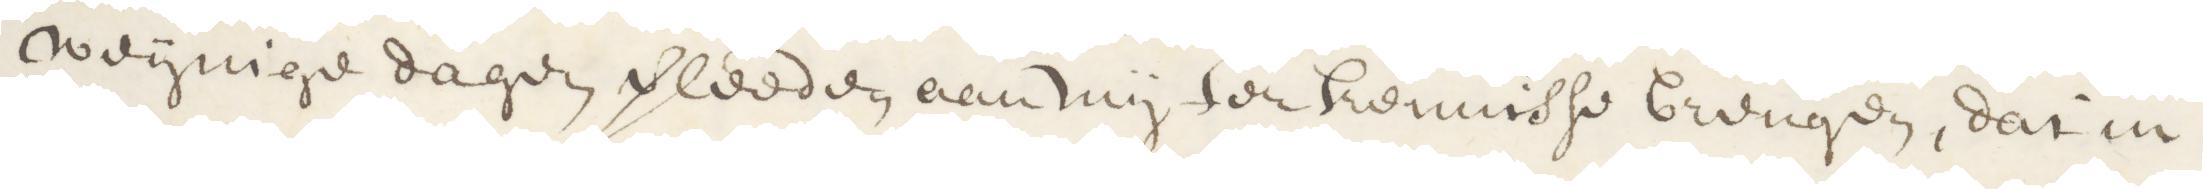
weijnige dagen verleeden aan mij ter kennisse brengen, dat in
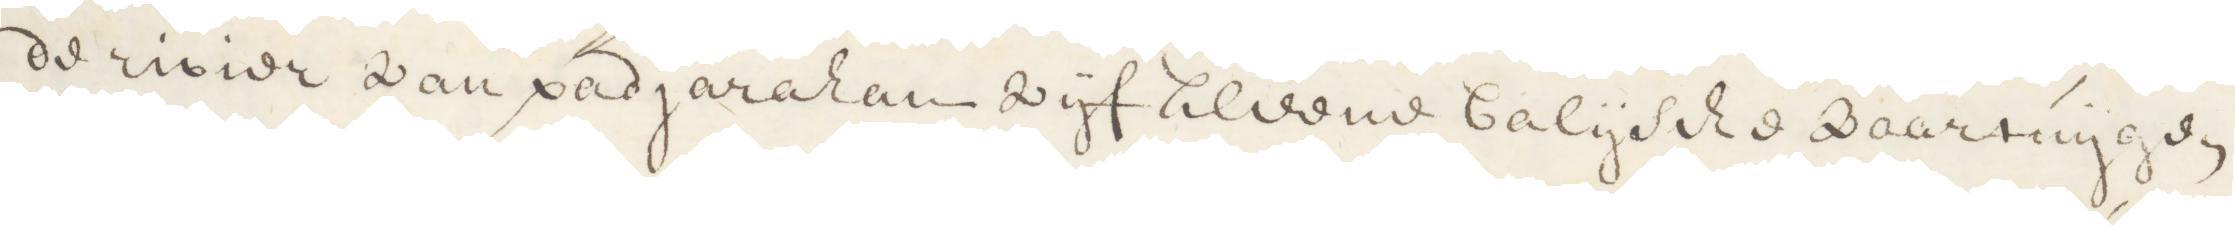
de rivier van padjarahan vijf kleene balijsche vaartuijgen
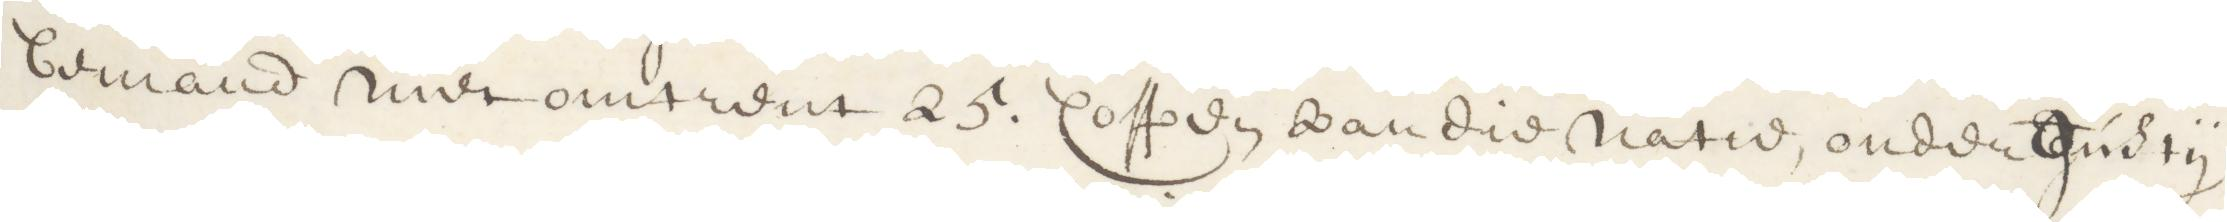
bemand met omtrent 25. Coppen van die natie, onder Gustij
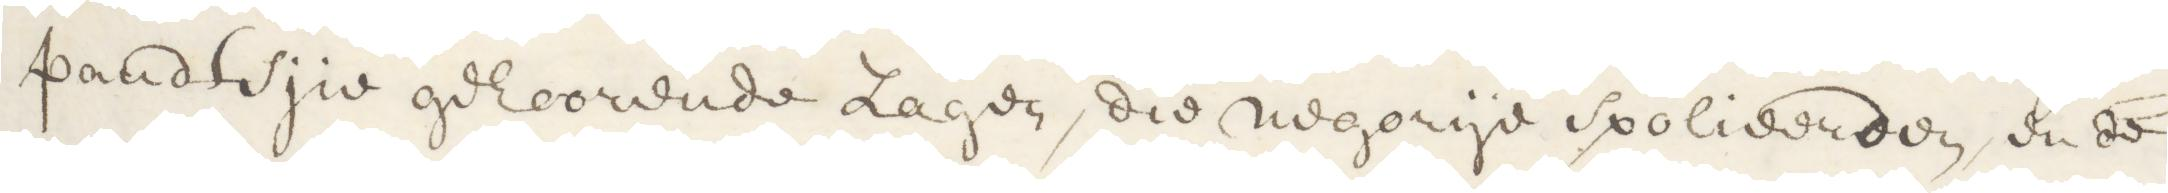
pandtsjie gehoorende lagen, die negorije spolieerden, en de
